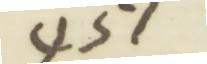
951
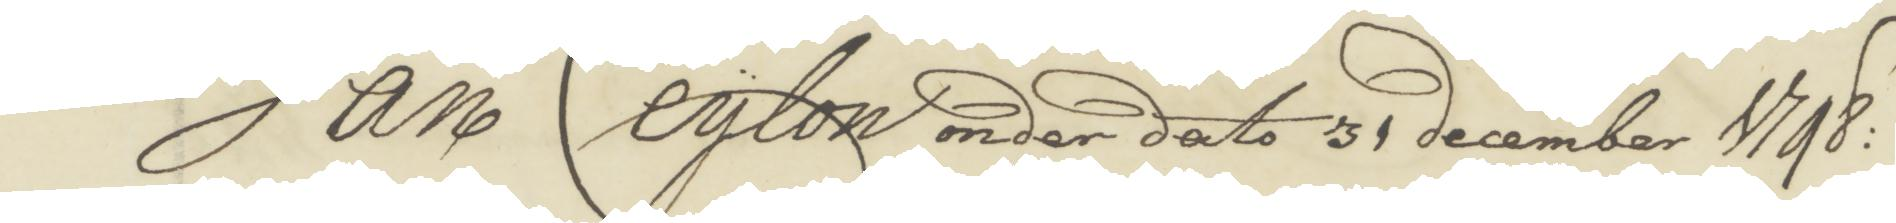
Van Ceijlon onder dato 31 december 1748:
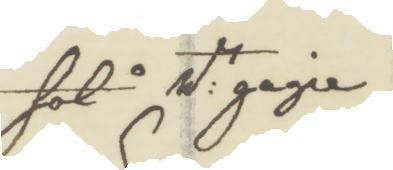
folo w:t gegie
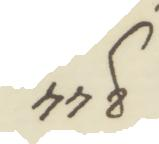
778
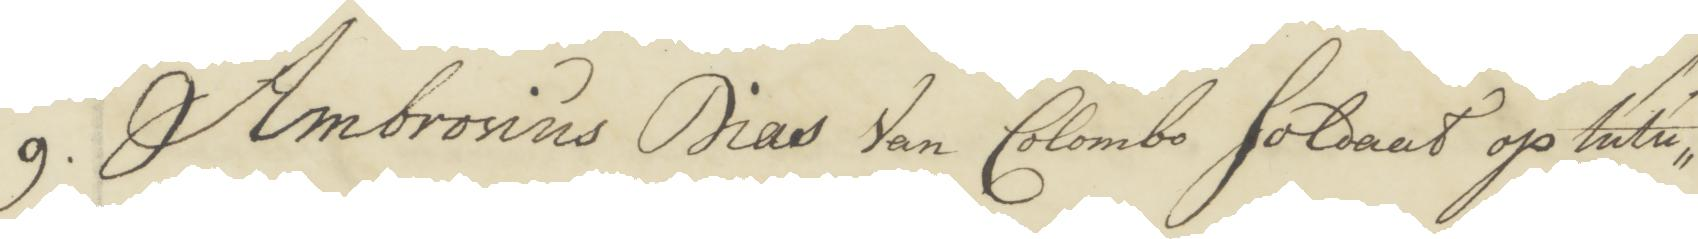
9. Ambrosius Dias van Colombo soldaat op tutu„
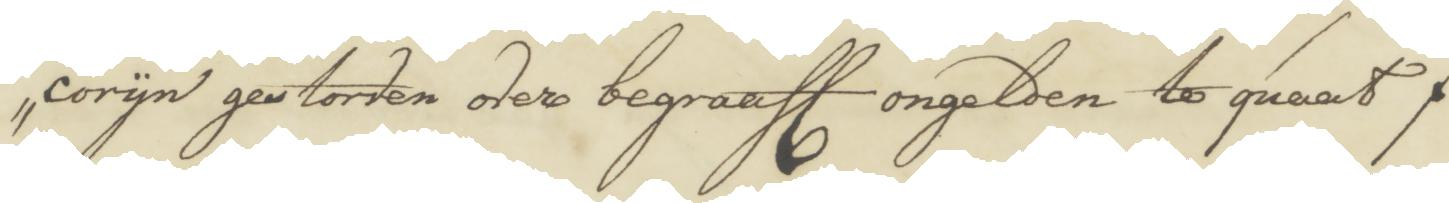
„corijn gestorven over begraaff ongelden te quaat ƒ
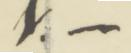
1. —
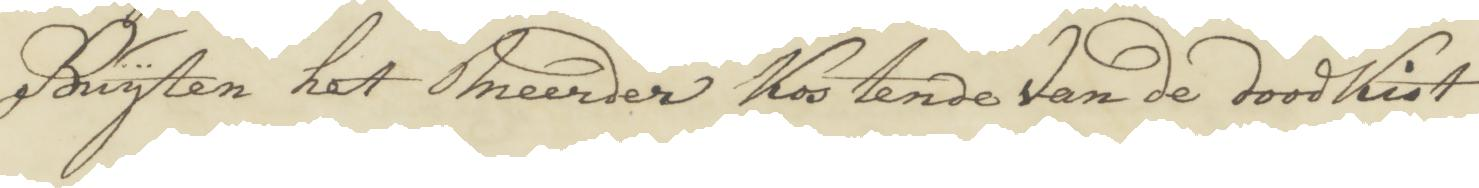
Buijten het meerder kostende van de doodkist
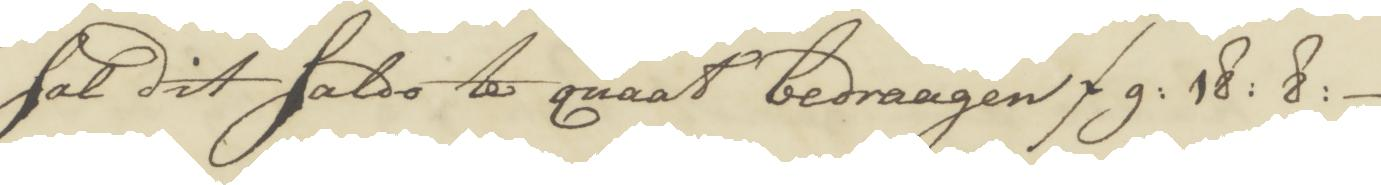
sal dit saldo te quaat bedraagen ƒ 9: 18: 8: —
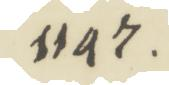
1147.
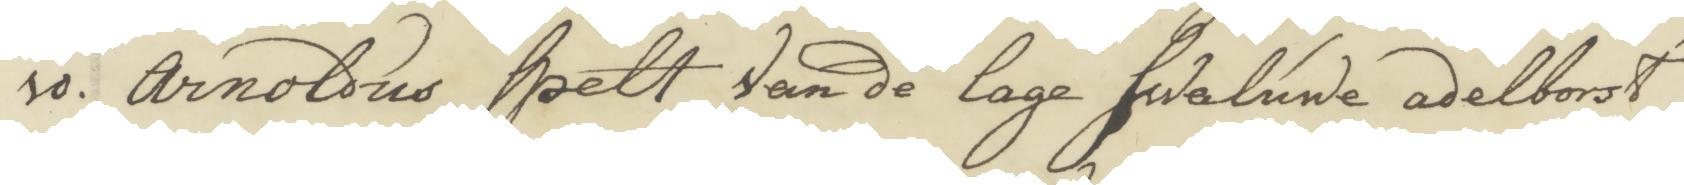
10. Arnoldus spelt van de lage swaluwe adelborst
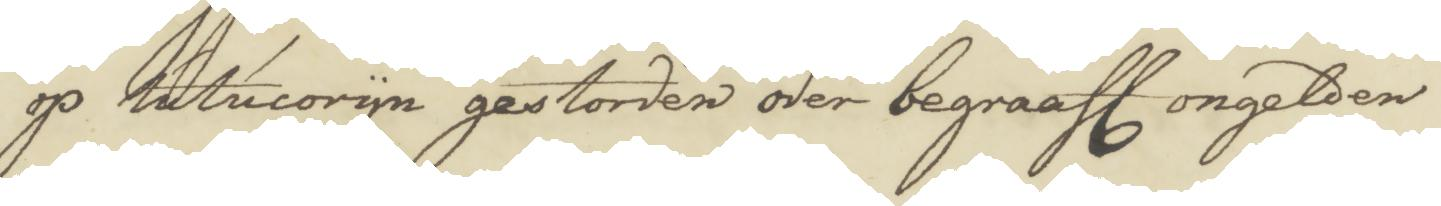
op tutucorijn gestorven over begraaff ongelden
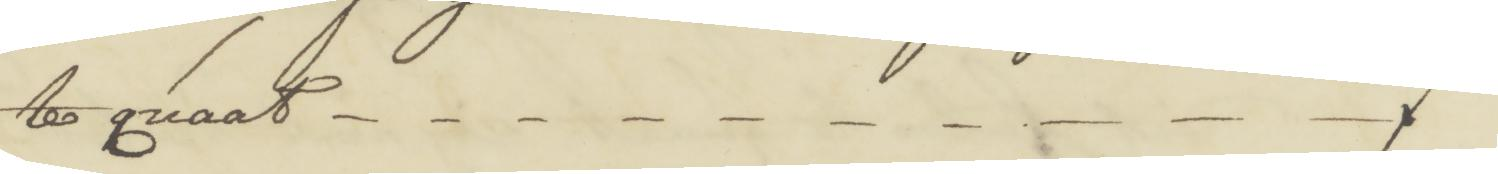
te quaat — — — — — — — . — — —ƒ
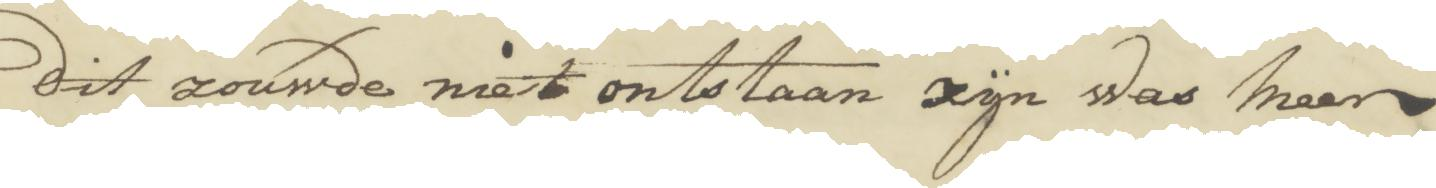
dit zouwde niet ontstaan zijn was meer
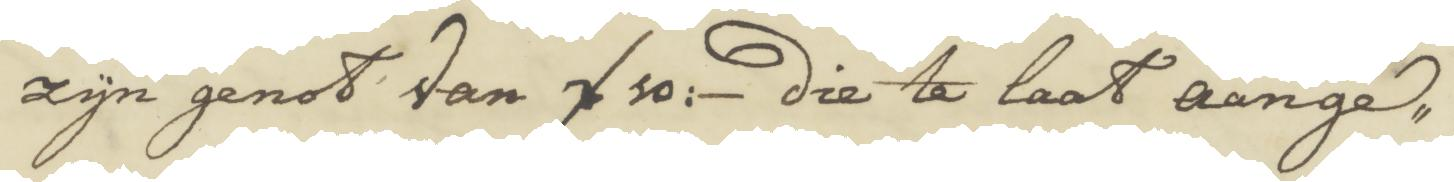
zijn genot dan ƒ10:— die te laat aange„
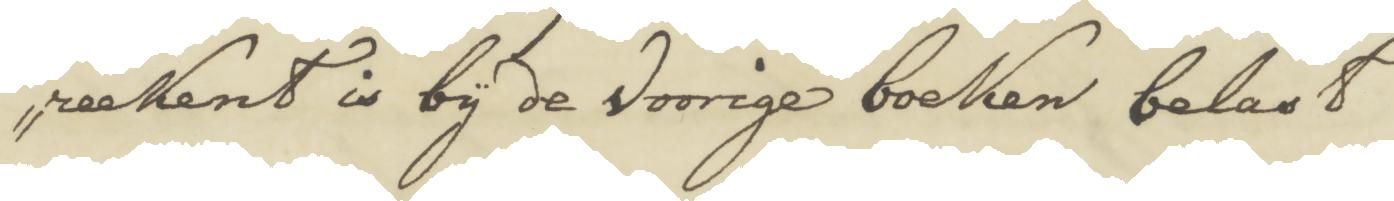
„reekent is bij de voorige boeken belast
